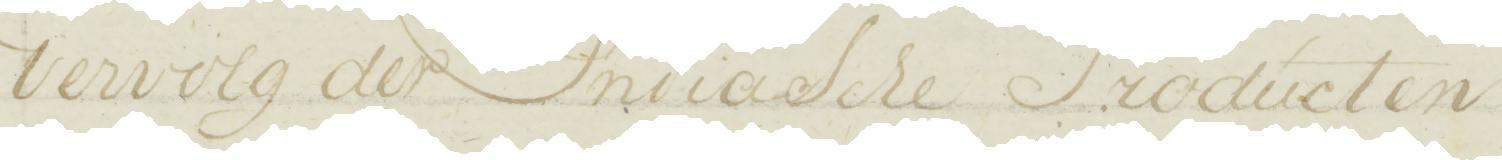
Vervolg der Indiasche Producten
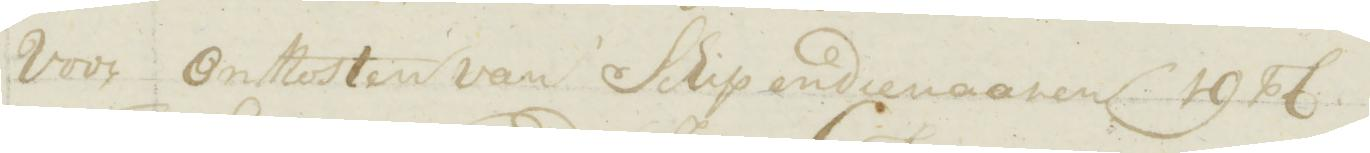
Voor Onkosten van schip en dienaaren 19 pC.
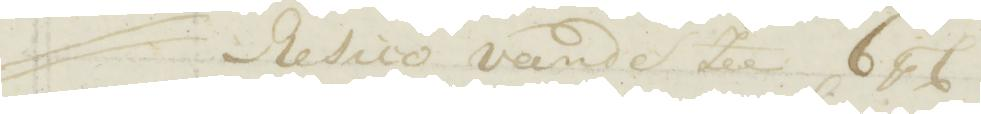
=Resico vande zee 6 pC
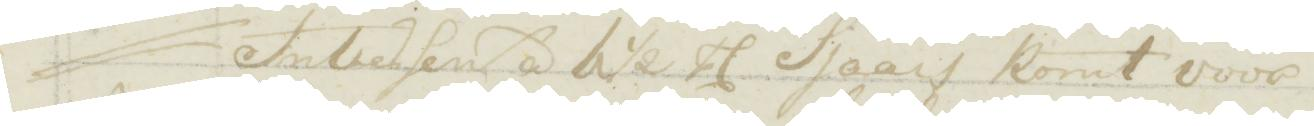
=Intressen @ 6½ pC sjaars komt voor
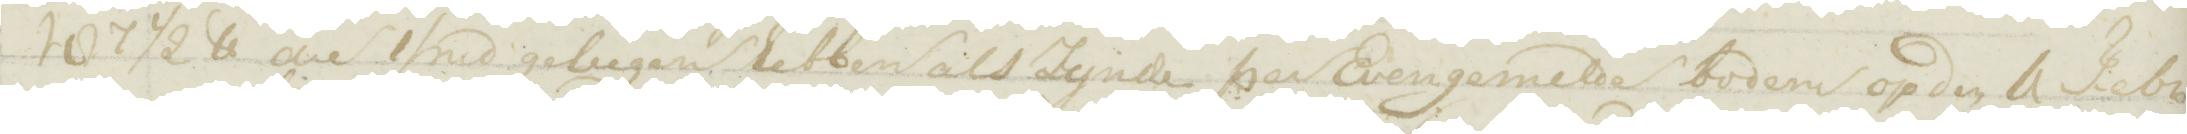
187½ lb die 1/md: geleegen hebben als zijnde per Evengemelde bodem op den 4 Febr
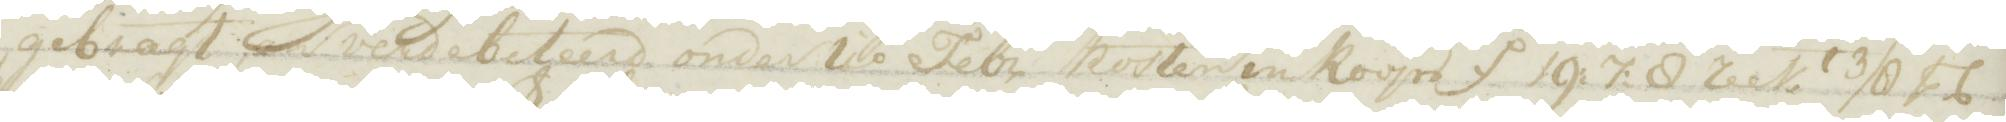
gebragt: en verdebiteerd onder Uo Febr kosten in koops ƒ. 19: 7: 8. reekt 3/8 pC
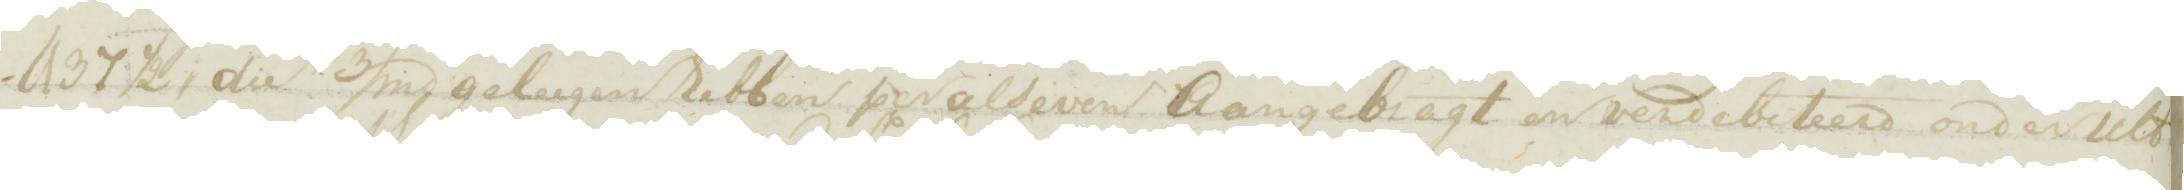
437:½, die 3/md: geleegen hebben per alseven aangebragt en verdebiteerd onder ult
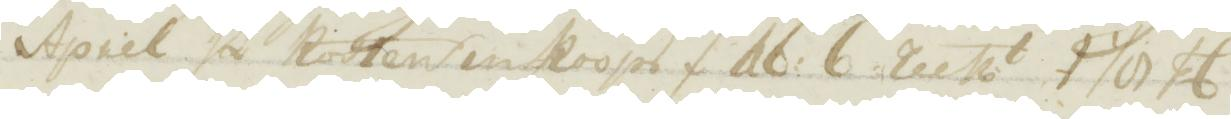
April JL kosten inkoops ƒ 46: 6: reekt ƒ 1/8 pC
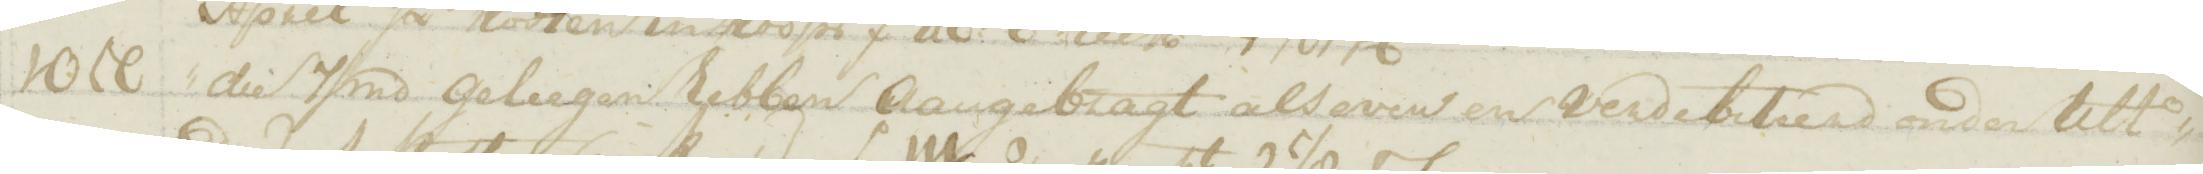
1056 die 7/md geleegen hebben aangebragt als even en verdebiteerd onder ult„o
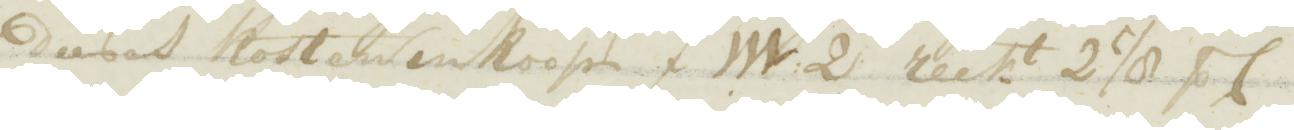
deeses kosten inkoop ƒ 111: 2: reekt 2 5/8. pC
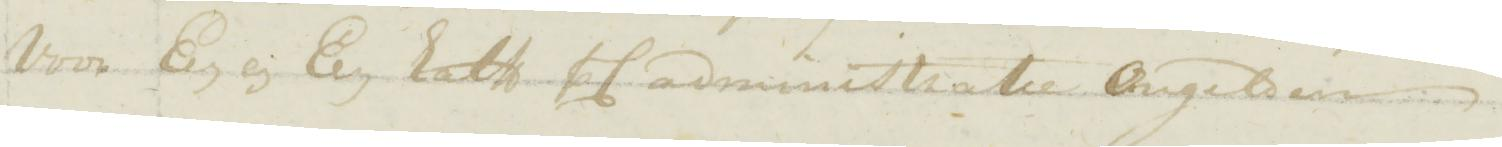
voor Een en Een halff pC administratie Ongelden
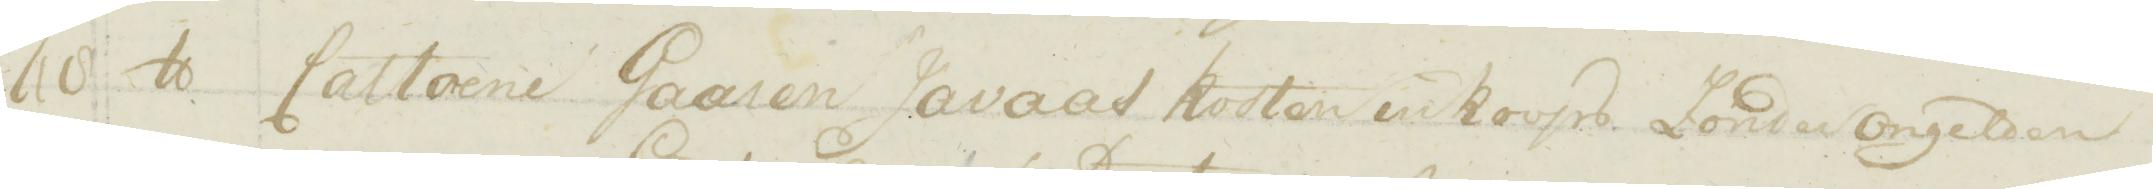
48 lb Cattoene Gaaren Javaas kosten inkoops zonder ongelden
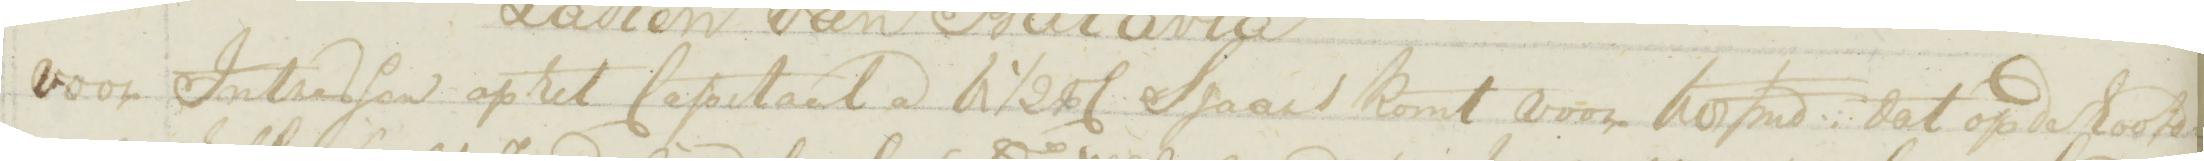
voor Intressen op het Capitaal @ 4½ pC sjaars komt voor 48/md.:. dat op de hoofd
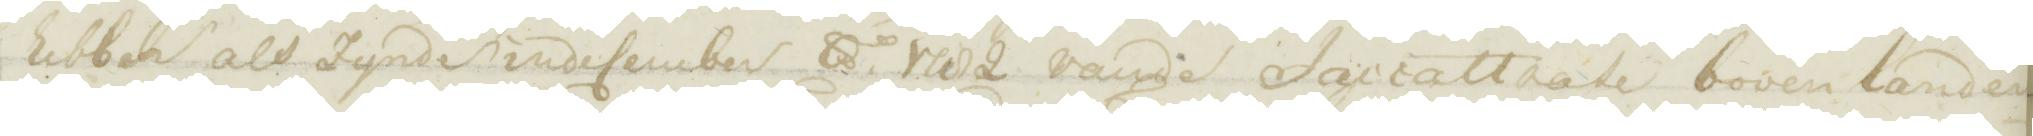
hebben als zynde a.o 1782 van de Iaccattrase boven landen
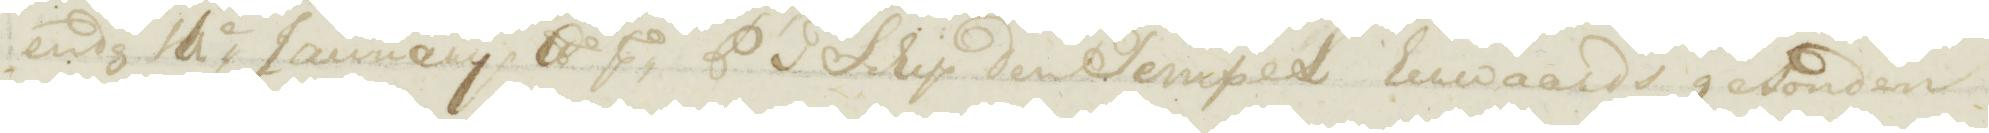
„enden 14„e January ao p„o P 'tT schip den Tempel herwaards gesonden
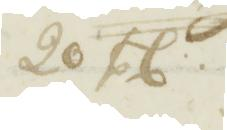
20 pC:
